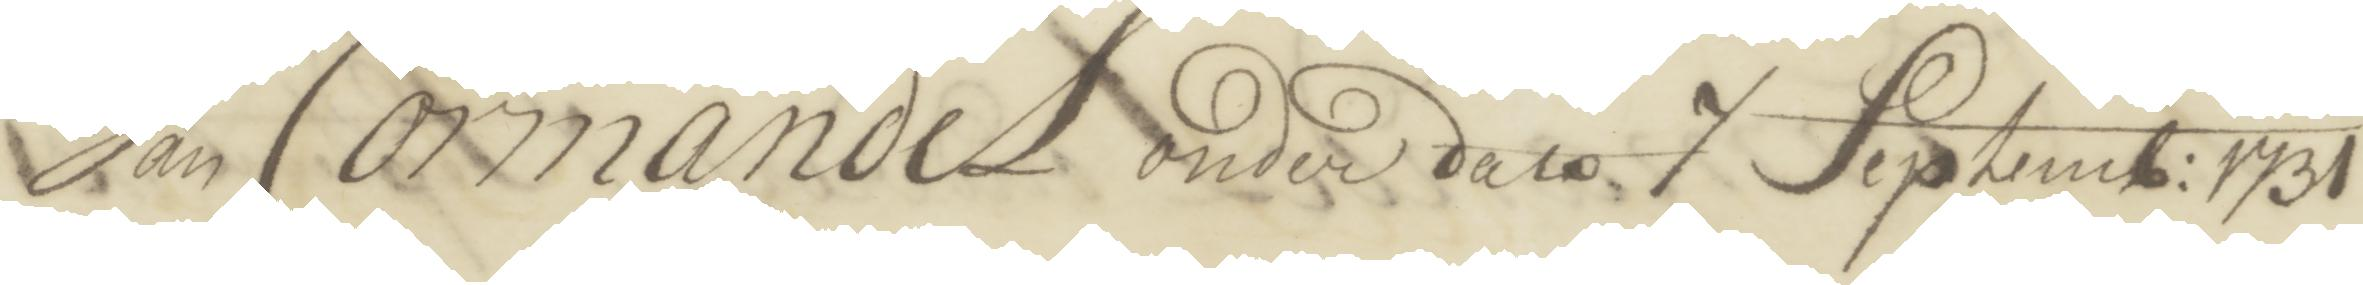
Van Cormandel onder dato 7 Septemb: 1731
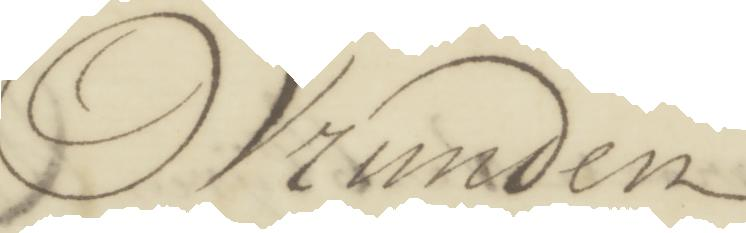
Vrunden,
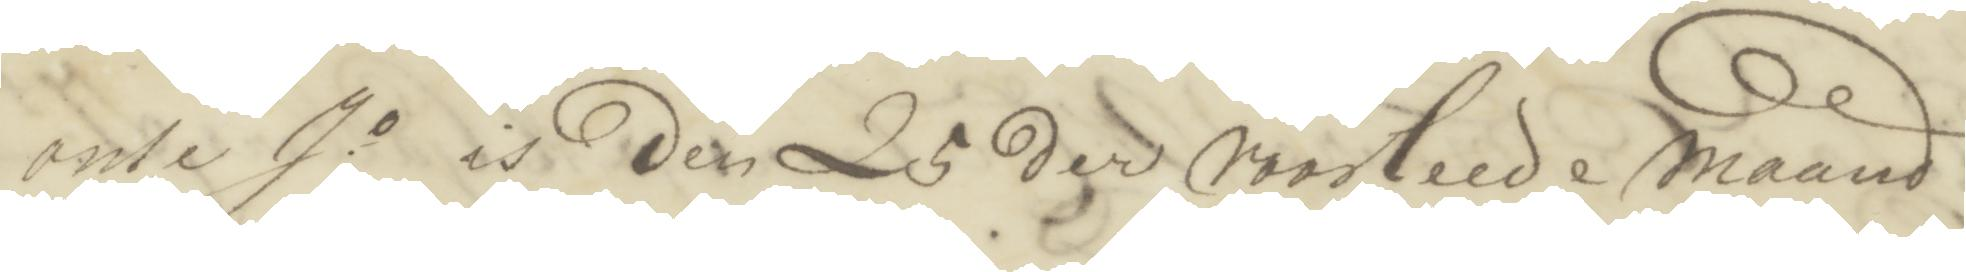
onse J:o is den 25 der voorleede maand
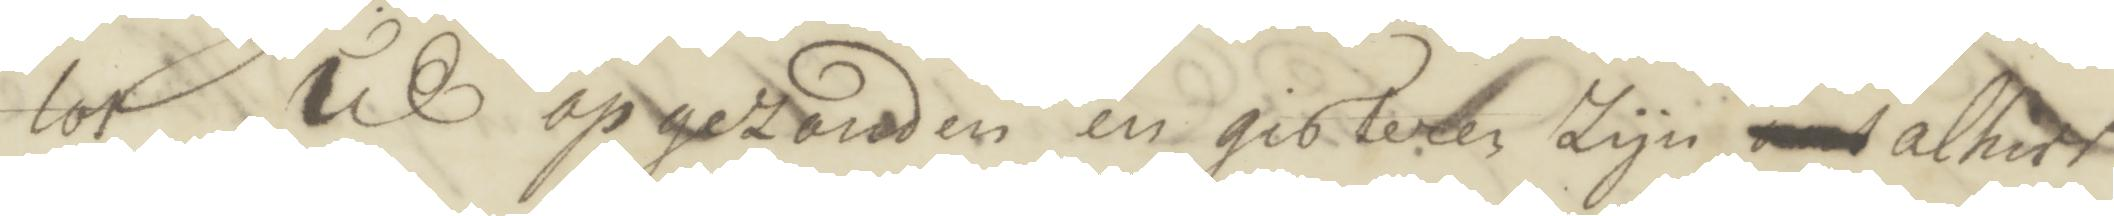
tot UE op gezonden en gisteren zijn ons alhier
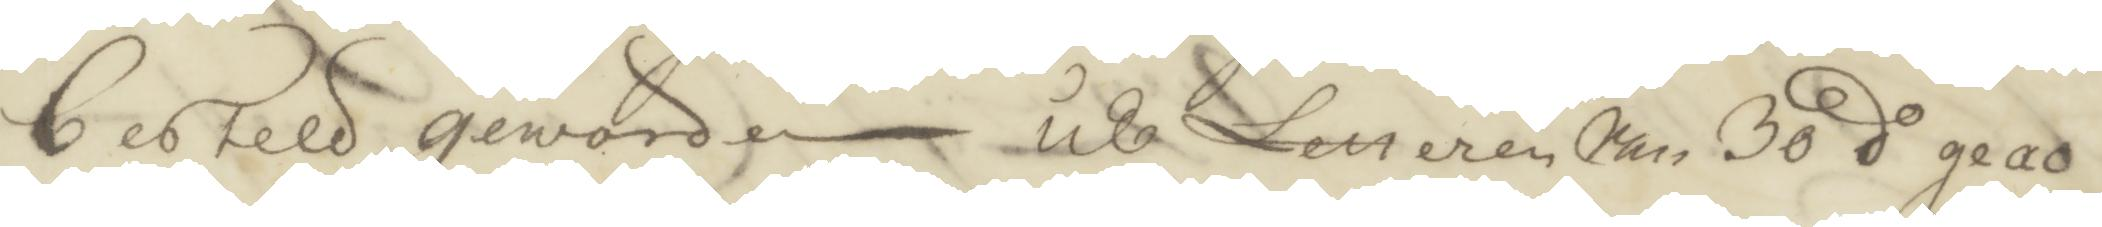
besteld geworden uE Letteren van 30 do geac
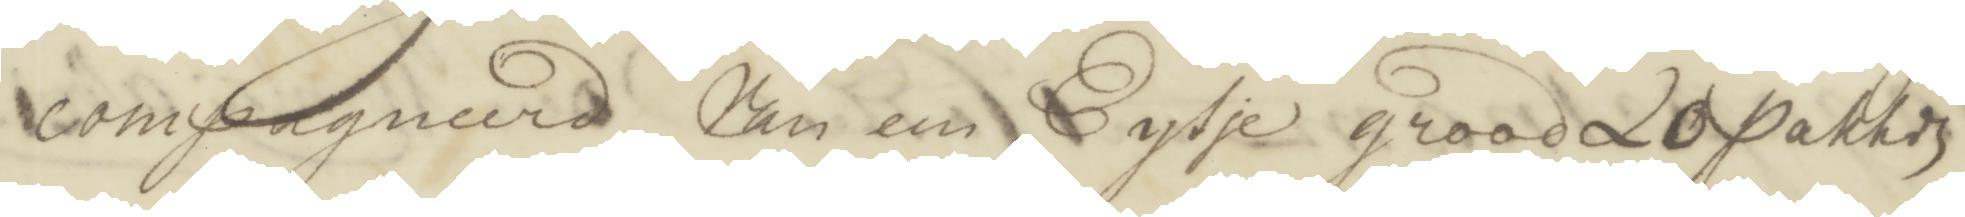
compagneerd van een Eysje grood 20 pakken
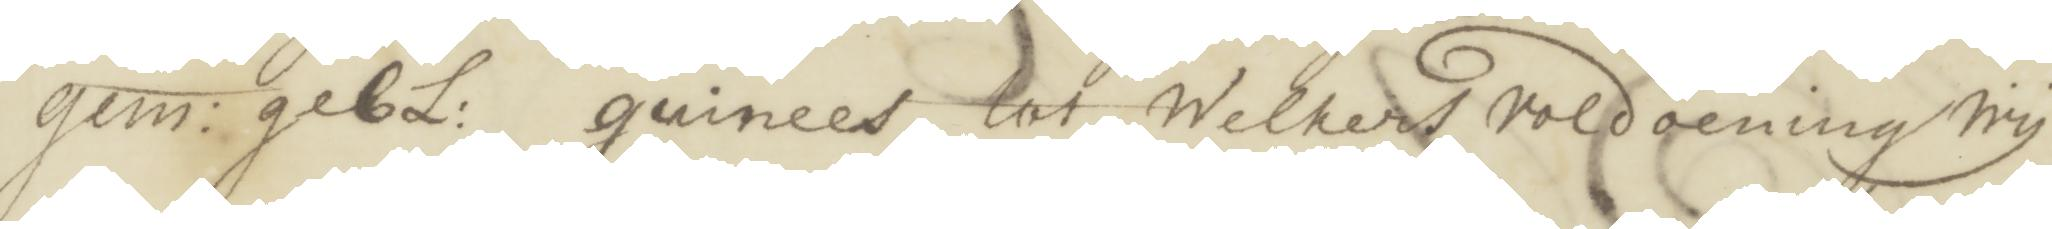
gem: gebl: guinees tot welkers voldoening wij
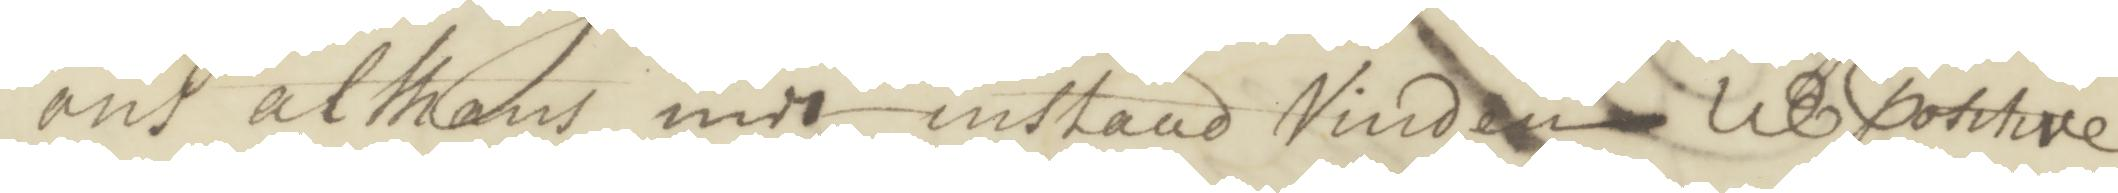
ons althans niet instaad vinden UE positive
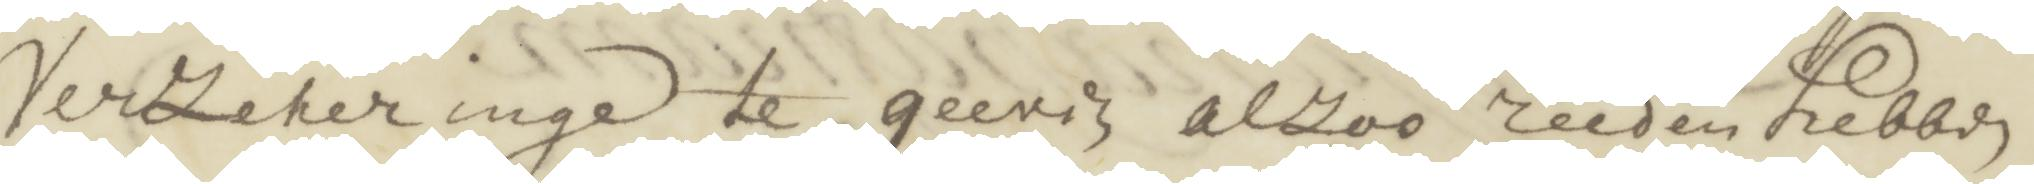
Verzekeringe te geeven alzoo reeden hebben
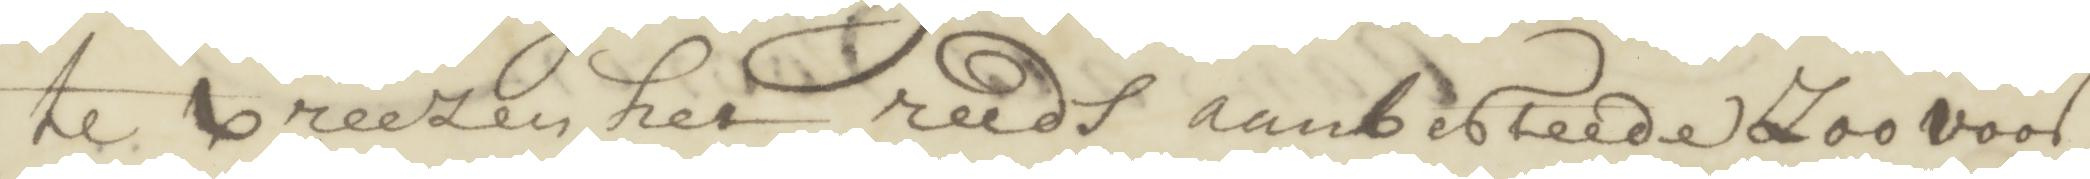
te vreezen het reeds aanbesteede zoo voor
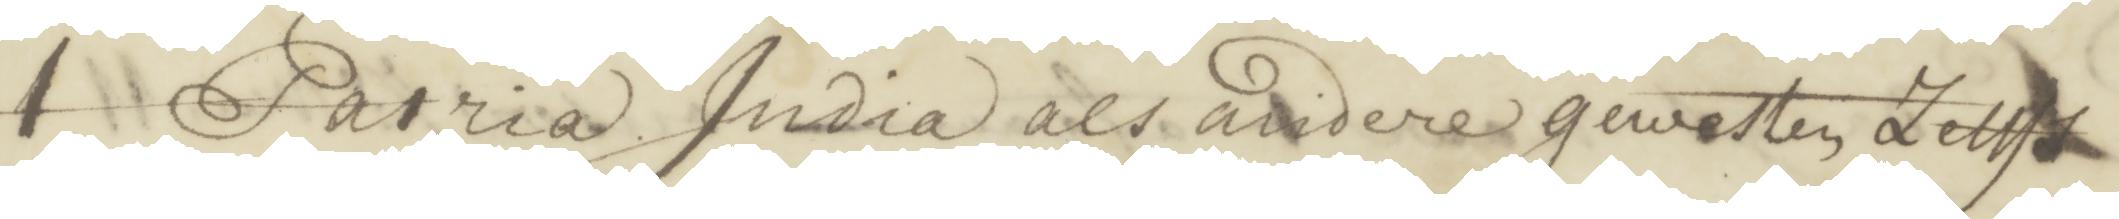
t Patria Jndia als andere gewesten zelfs
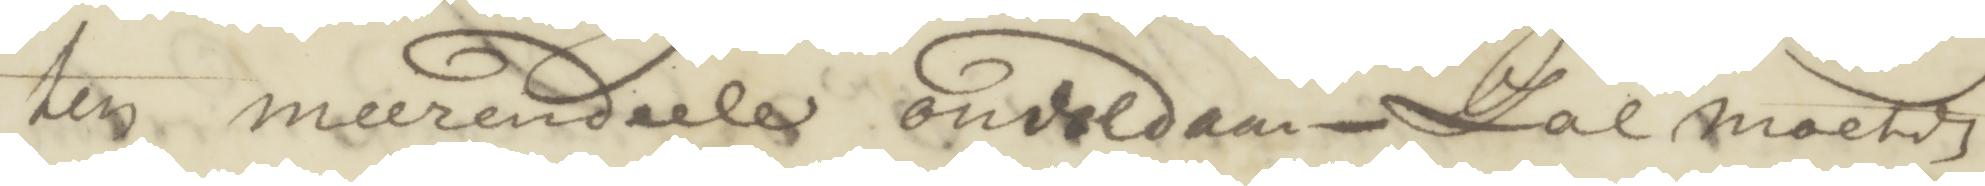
ten meerendeele onvoldaan zal moeten
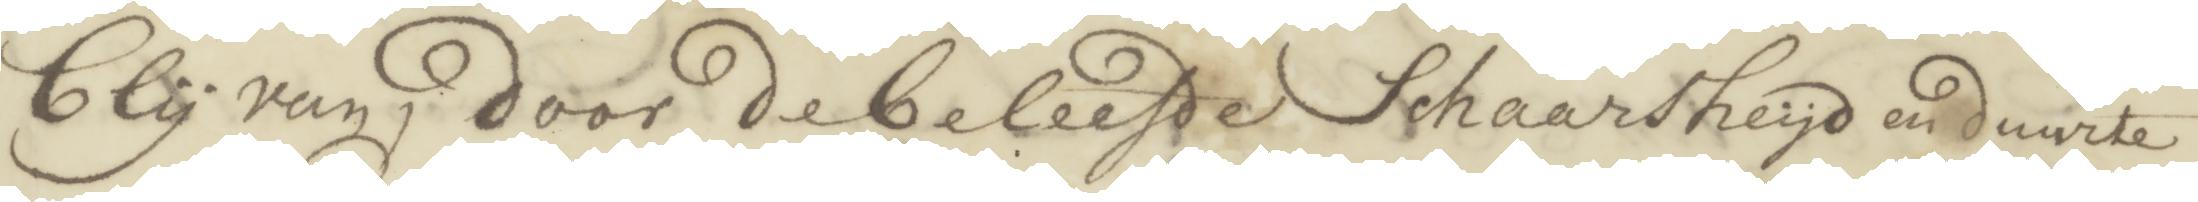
blij van, door de beleefde schaarsheijd en duurte
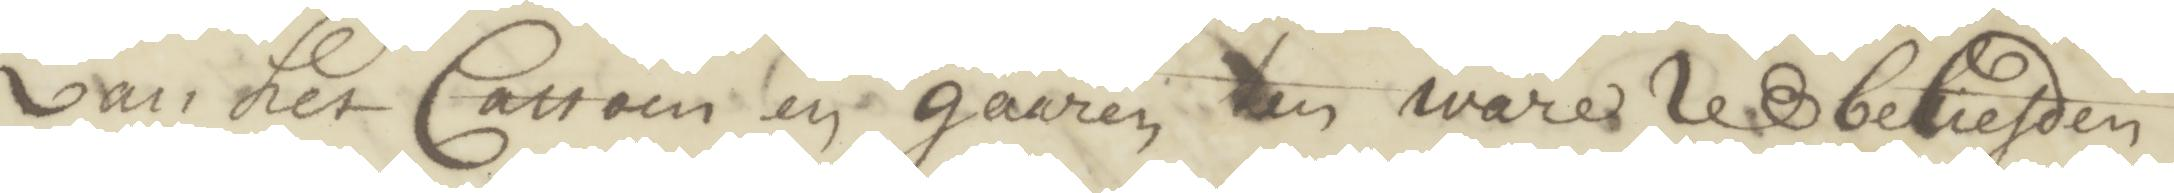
van het Cattoen en gaaren ten ware UE beliefden
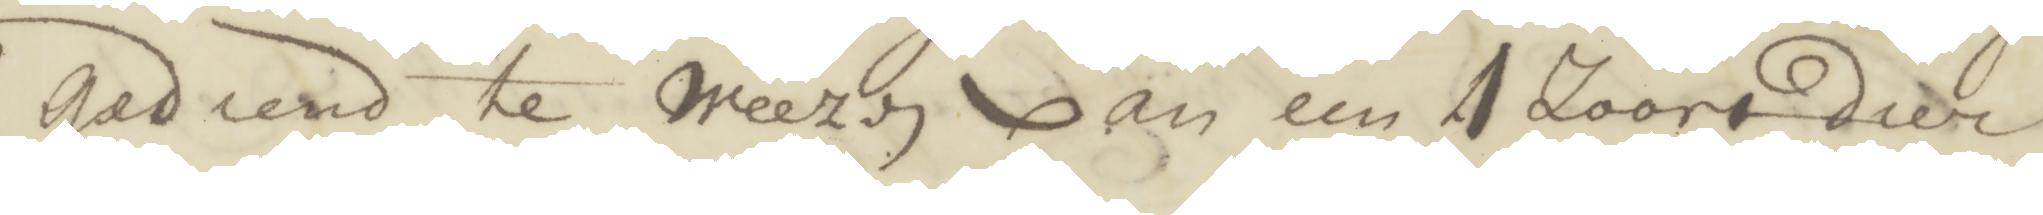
gediend te weezen van een 4 zoort dier
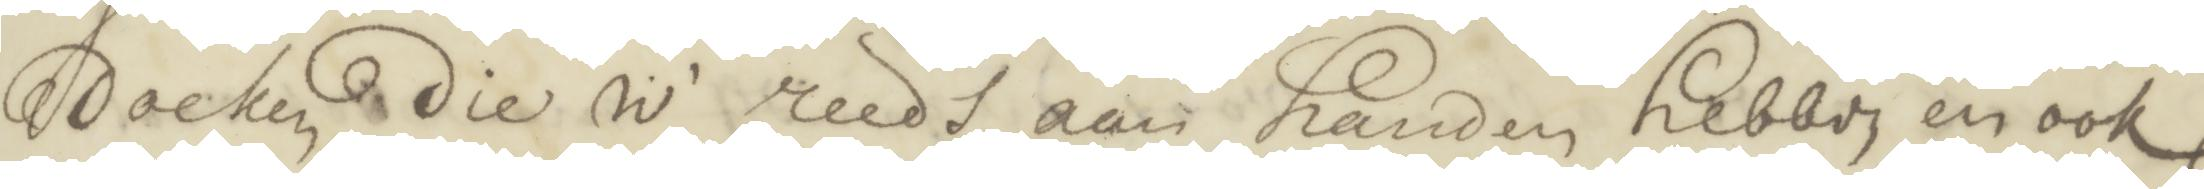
doeken die w' reeds aan handen hebben en ook
